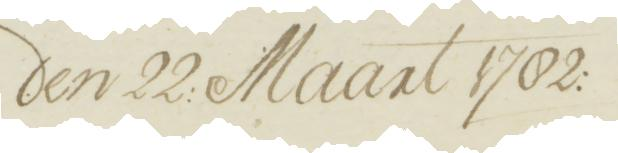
den 22: Maart 1782:
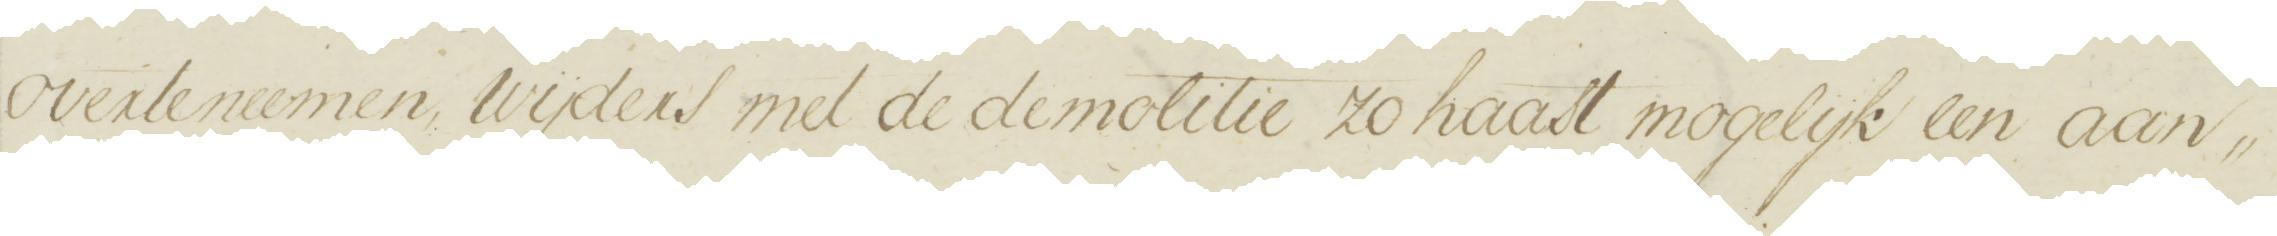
overteneemen, wijders met de demolitie zo haast mogelijk een aan„
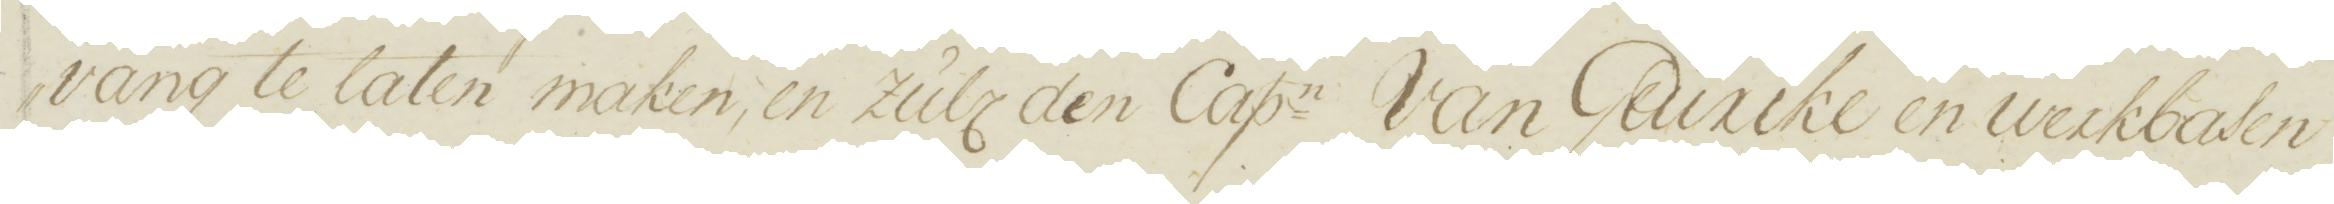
„vang te laten maken, en zulx den Cap=n van Geurike en werkbasen
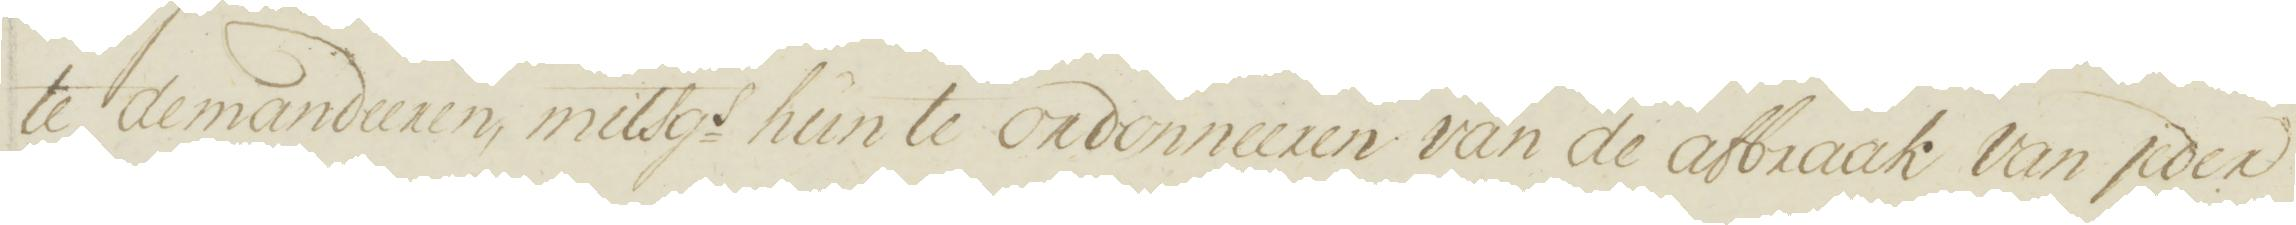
te demandeeren, mitsg=s hun te ordonneeren van de afbraak van jeder
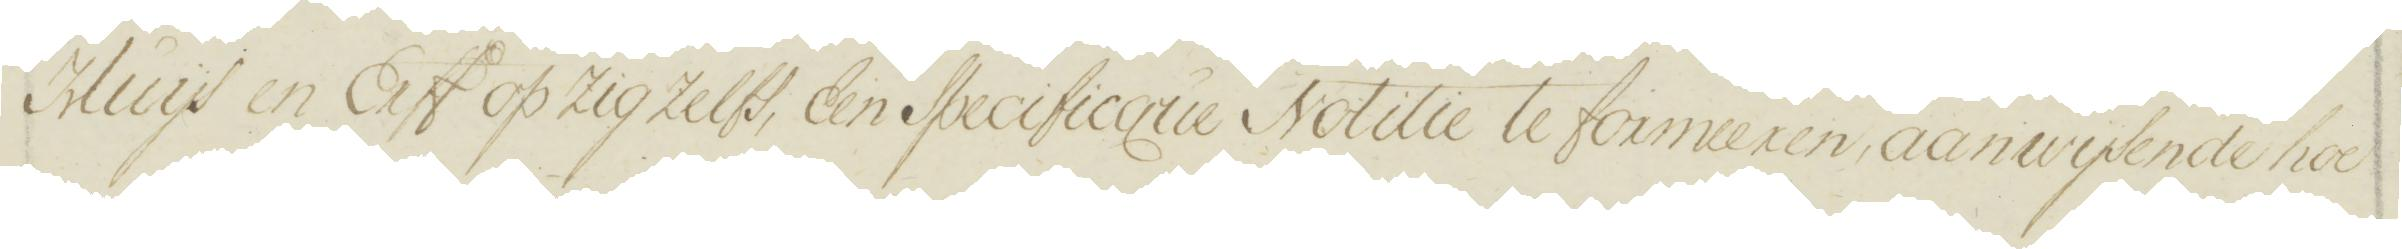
Huijs en Erff op zig zelfs, Een specificque Notitie te formeeren, aanwijsende hoe
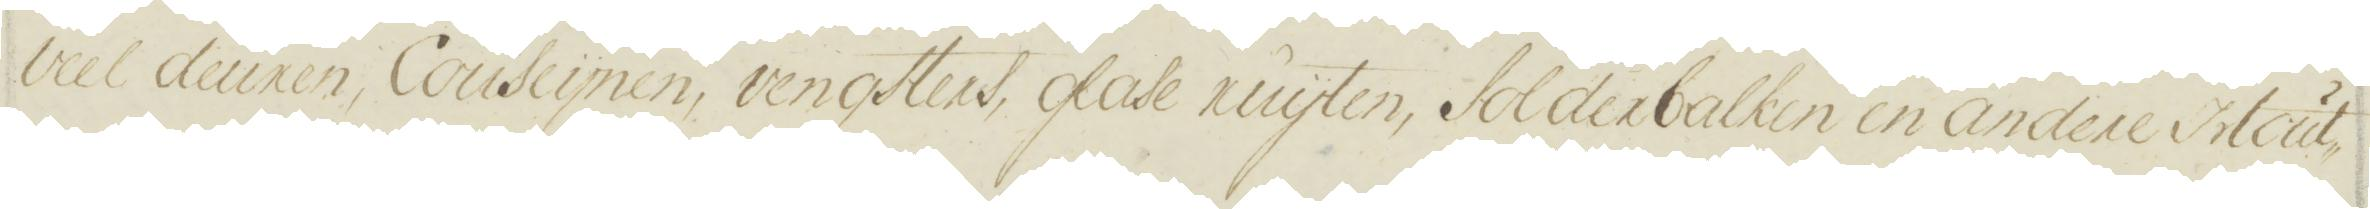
veel deuren, Couseijnen, vengsters, glase ruijten, solderbalken en andere Hout„
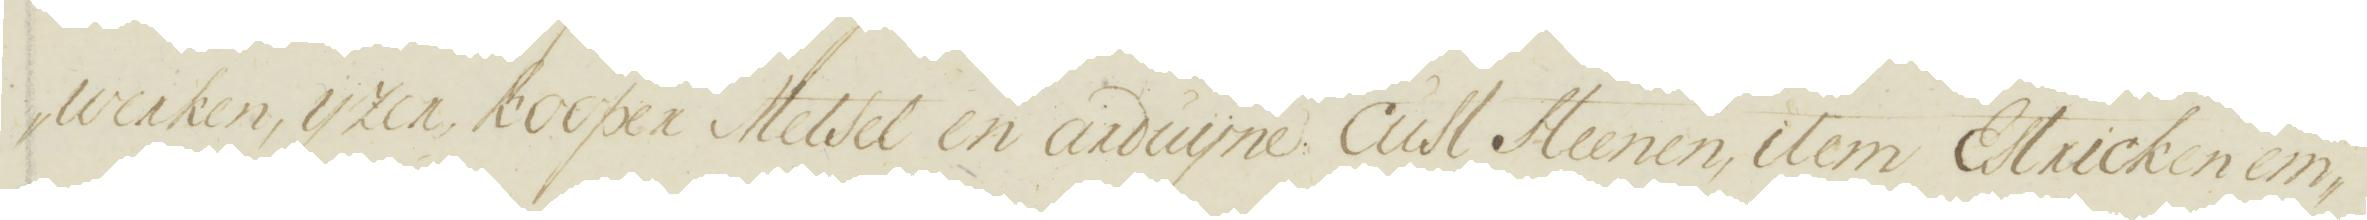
„werken, ijzer, kooper Metsel en arduijne Cust stenen, item Estricken em„
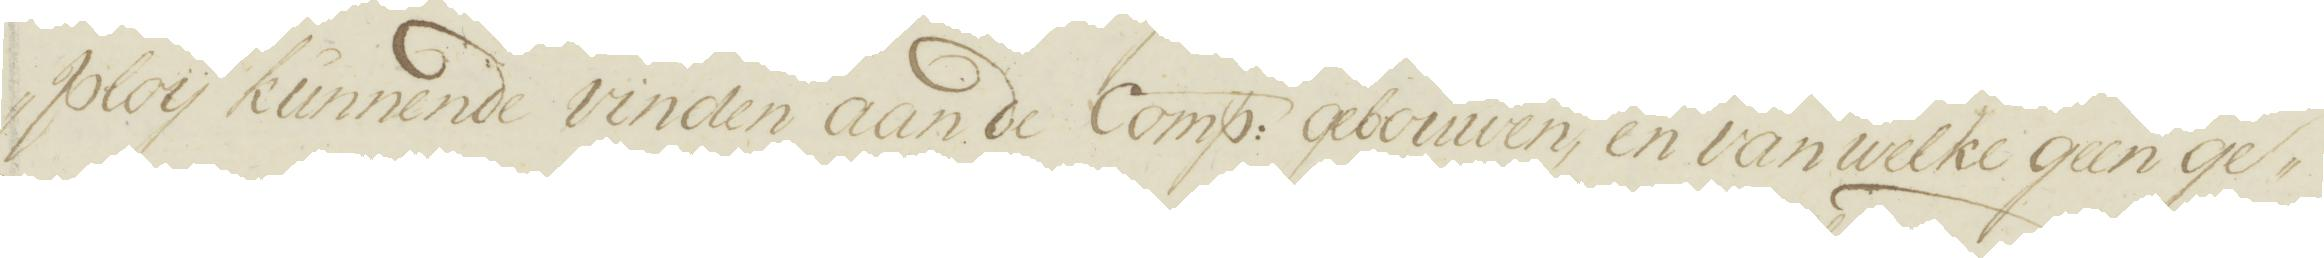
„ploij kunnende vinden aan de Comp: gebouwen, en van welke geen ge„
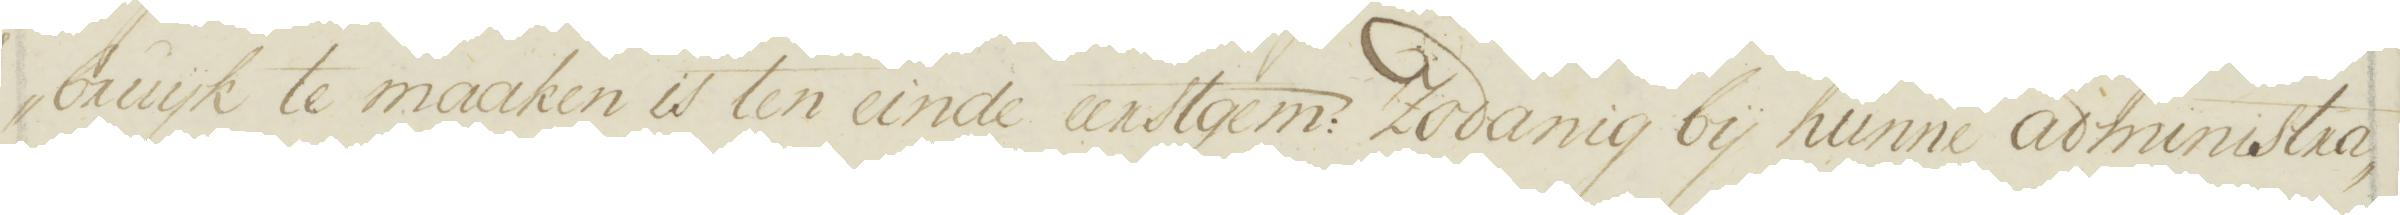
„bruijk te maaken is ten einde eerstgem: zodanig bij hunne administra„
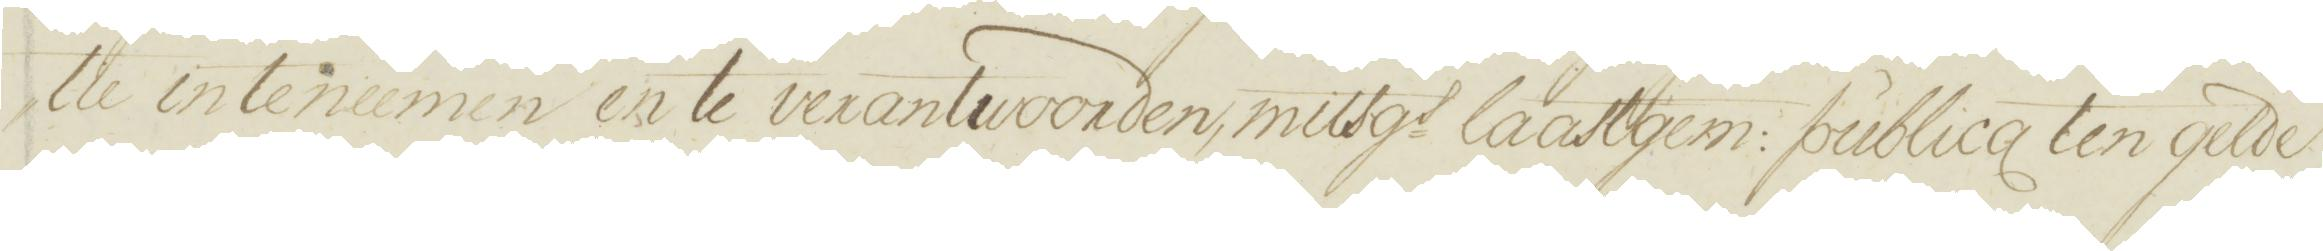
„tie inteneemen en te verantwoorden, mitsg=s laastgem: publicq ten gelde
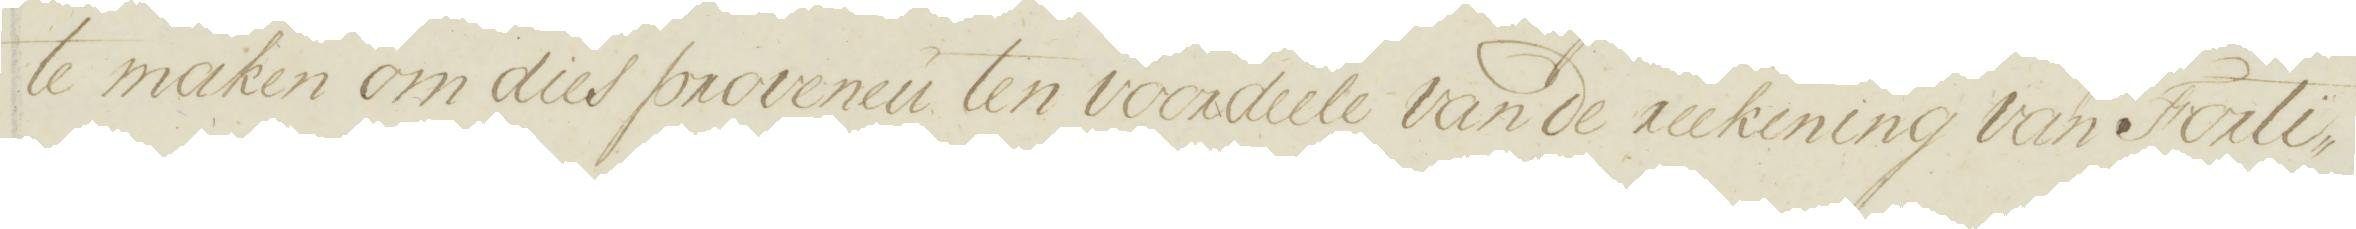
te maken om dies proveneu ten voordeele van de reekening van Forti„
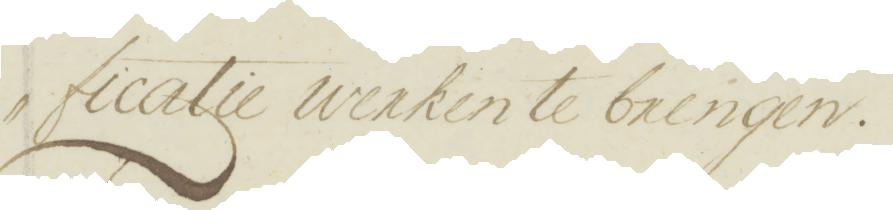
„ficatie werken te brengen.
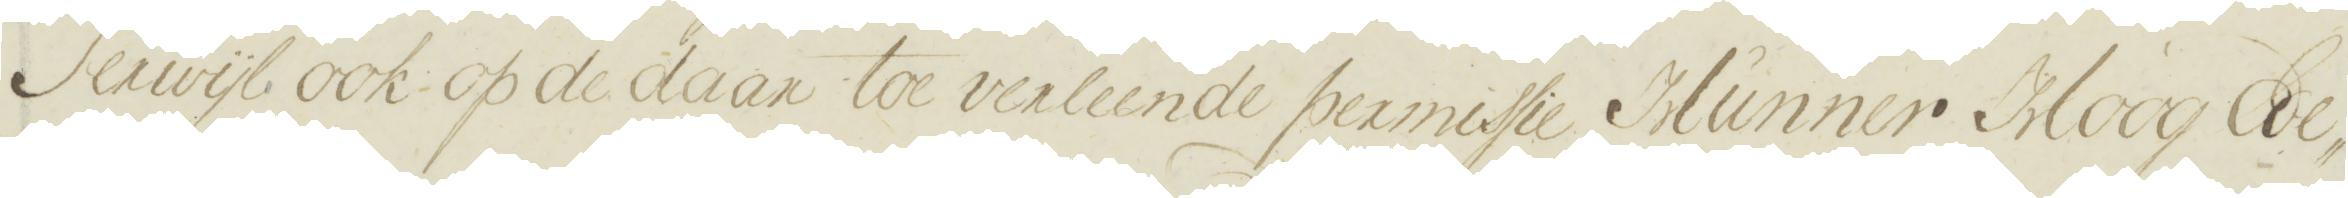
Terwijl ook op de daar toe verleende permissie Hunner Hoog Ede
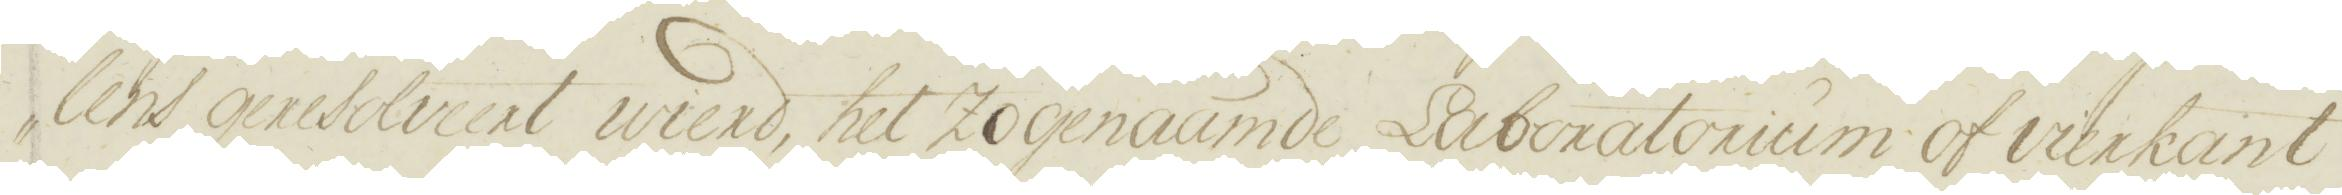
„lens geresolveert wierd, het zogenaamde Laboratorium of vierkant
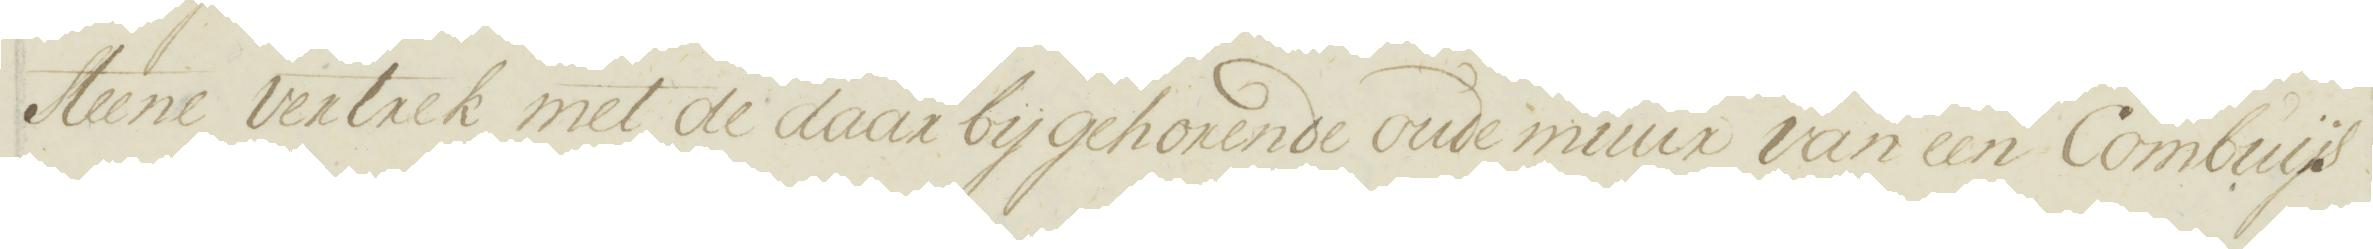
steene vertrek met de daar bij gehorende oude muur van een Combuijs
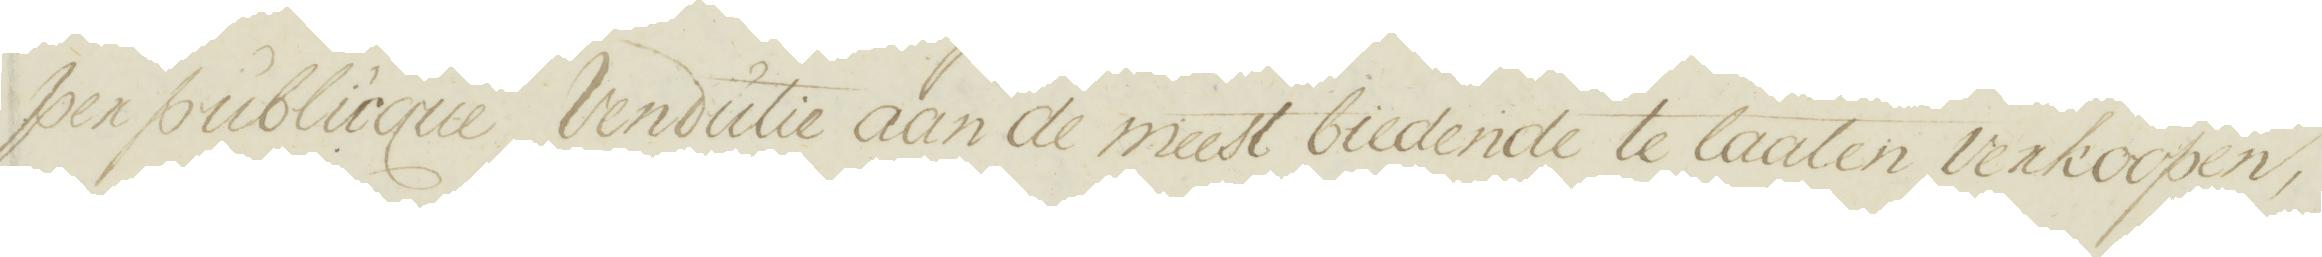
per publicque vendutie aan de meest biedende te laaten verkoopen,
